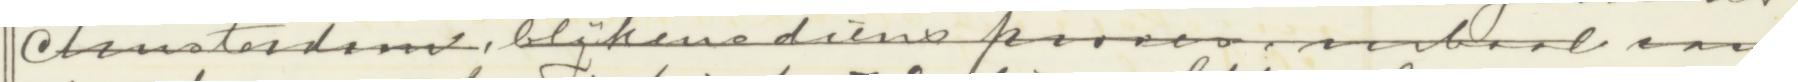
Amsterdam, blijkens diens proces-verbaal van
